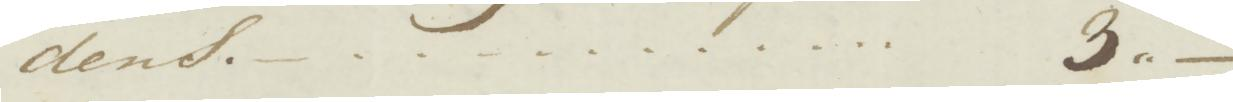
dens. 3 „-
